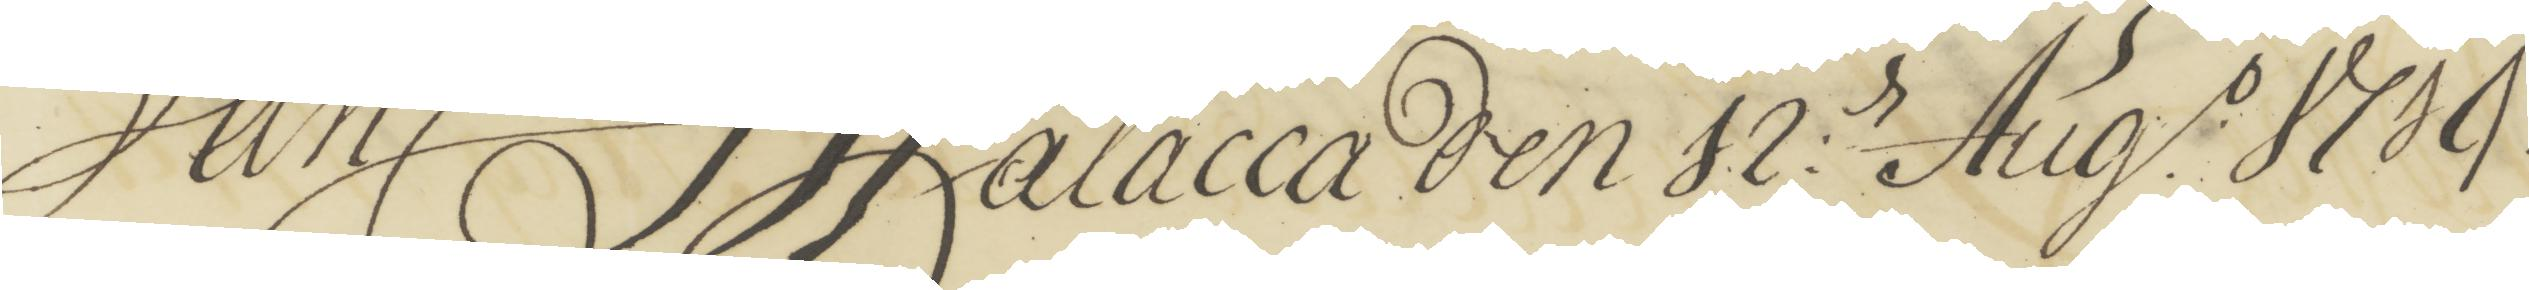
Van Malacca den 12:en Aug:o 1714.
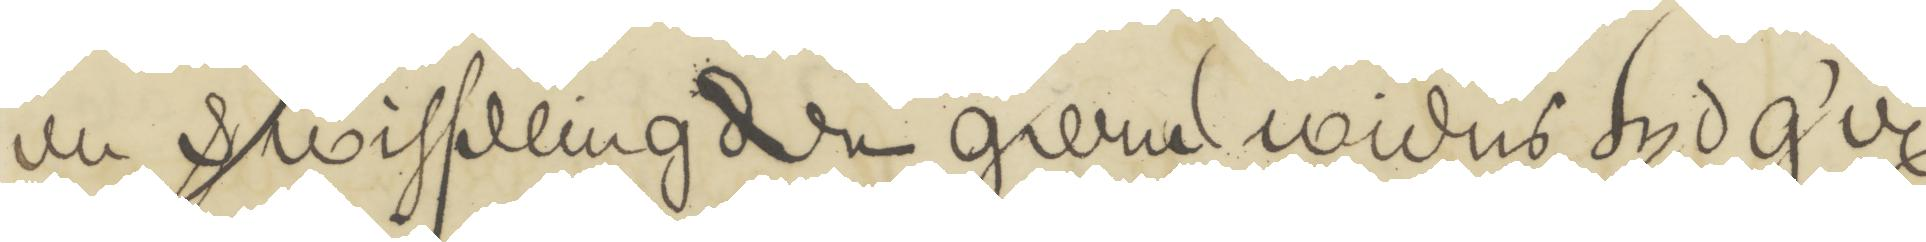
en verwisseling der geene wiens tyd g’ex
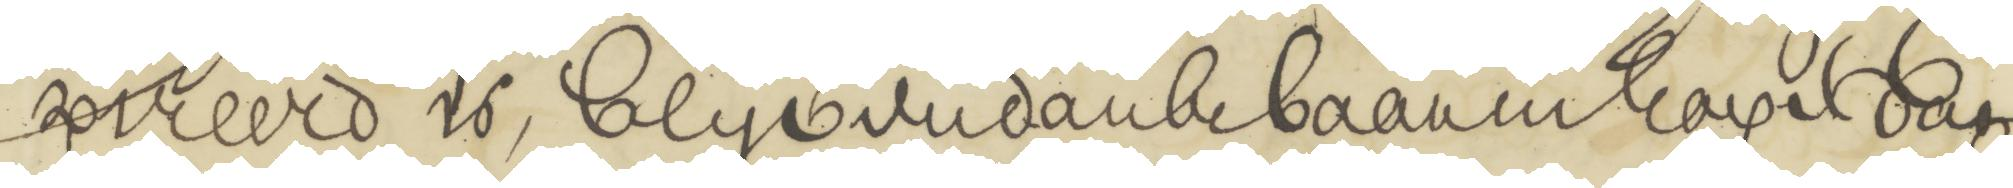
pireerd is, blyven dankbaar in hope dat
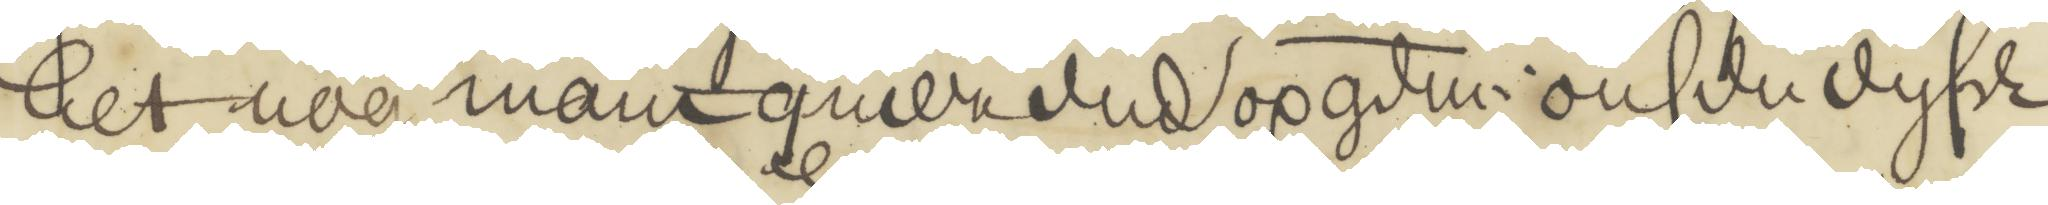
het nog mancqueerend op gem: onsen eysch
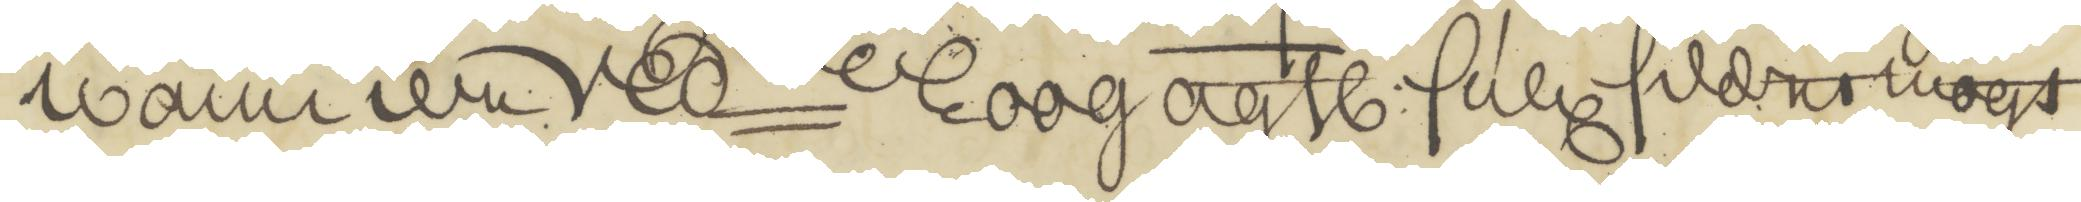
wanneer UEd=le hoog agtb: sulx sedert mogt
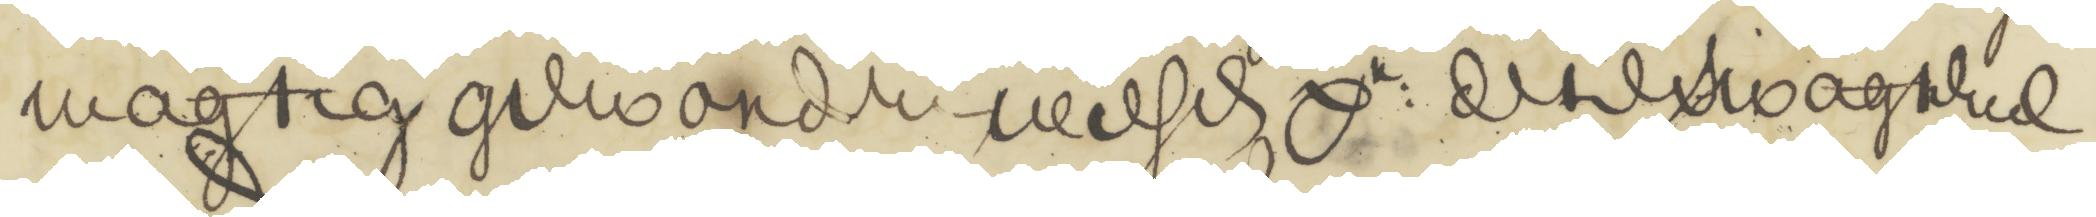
magtig geworden wesen p:r de te verwagtende
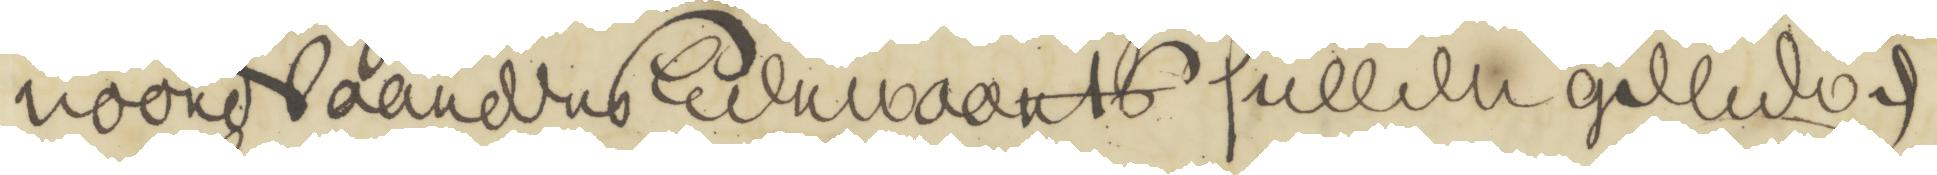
noord vaarders herwaarts sullen gelieven
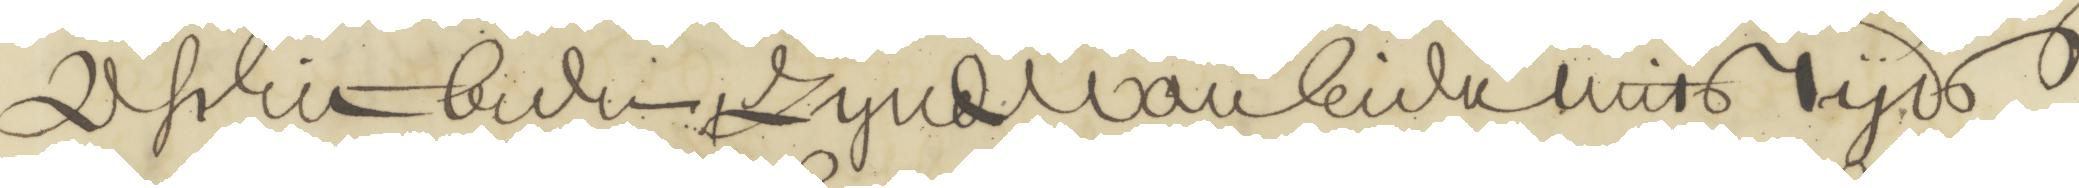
teschicken, Zynde van hier mits tijds
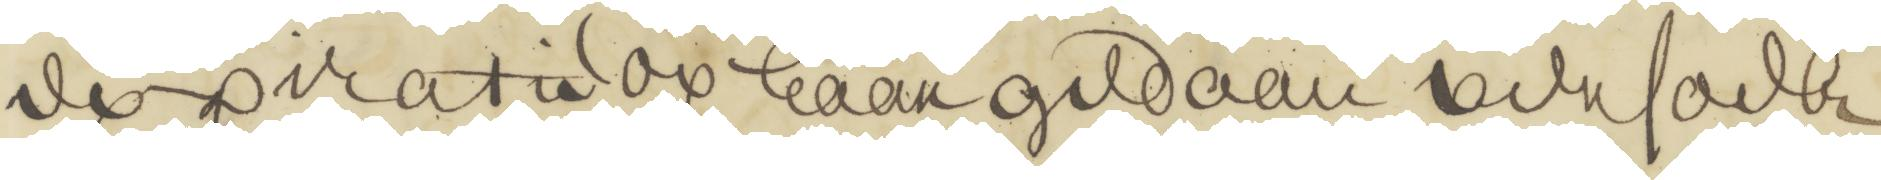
expiratie op haar gedaan versoek
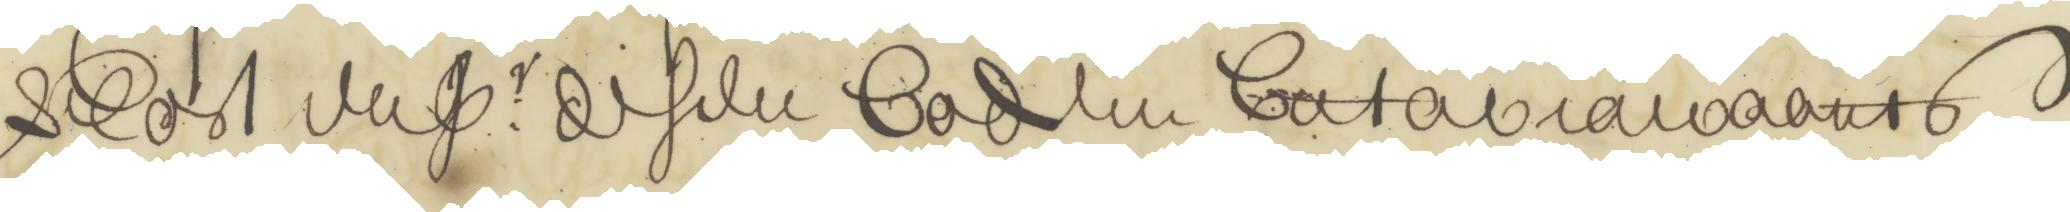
verlost en p:r desen bodem bataviawaarts
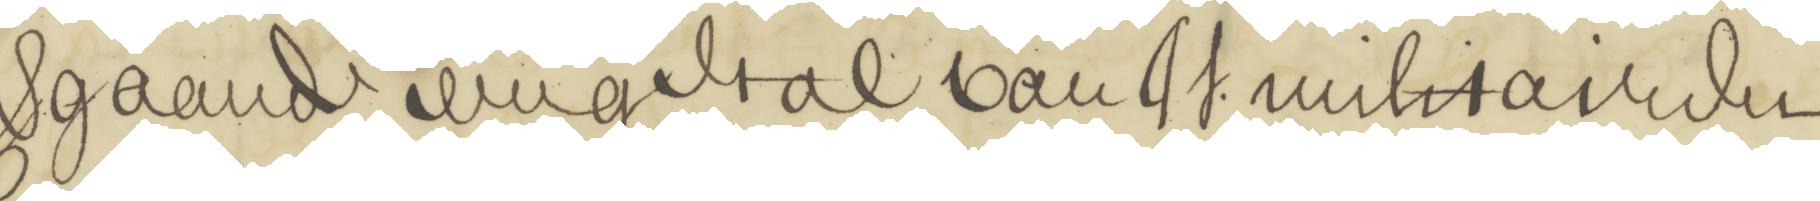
vergaande een getal van 41. militairen
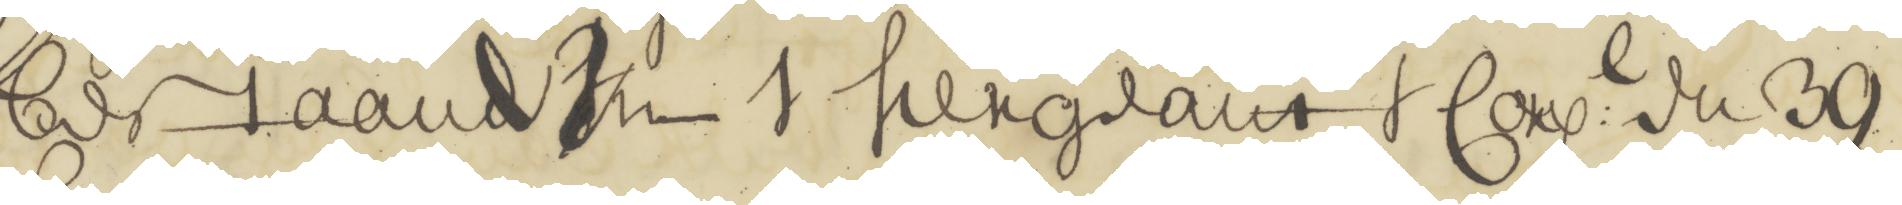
bestaande In 1 sergeant 1 Corp:l en 39
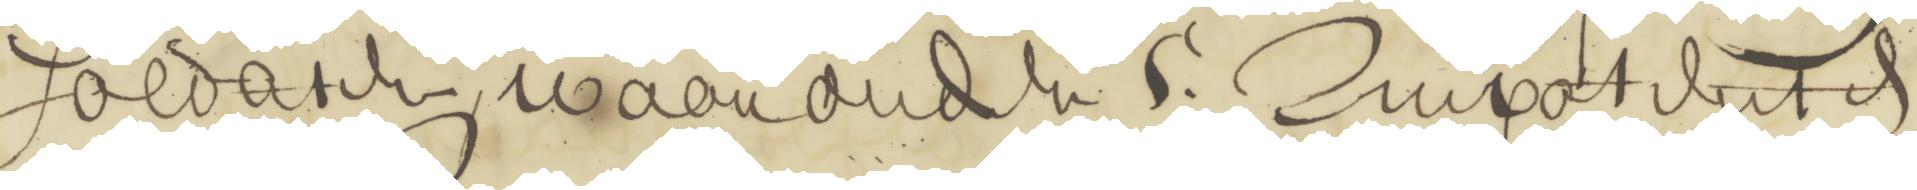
Soldaten, waar onder 5. Impotenten
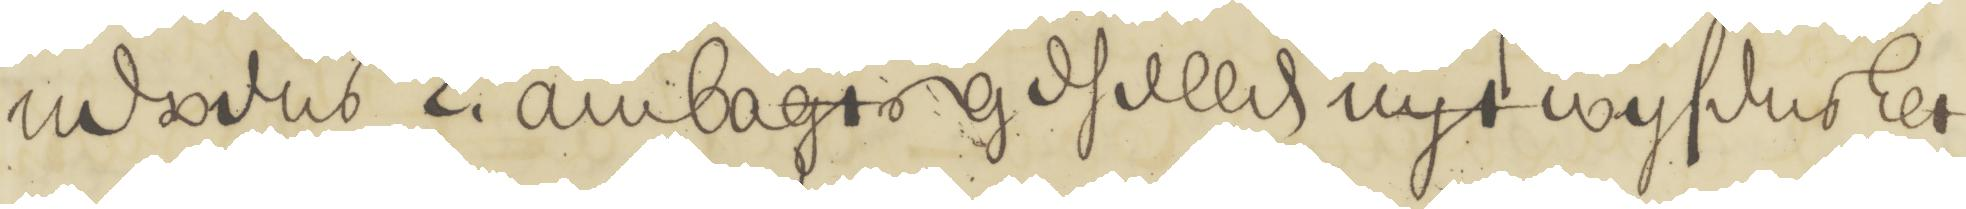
nevens 2. ambagts gesellen uyt wysens het
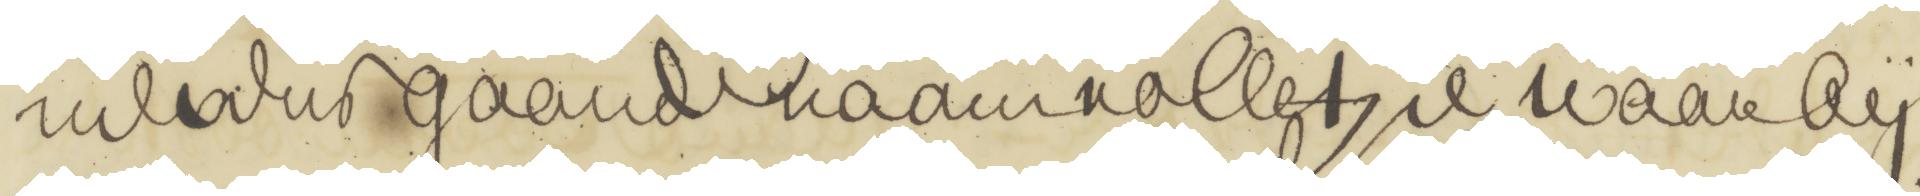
nevensgaande naam rolletje waar bij
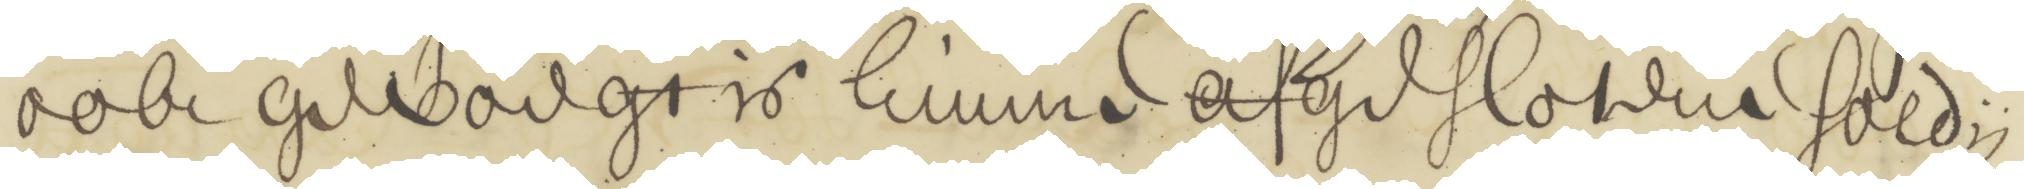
ook gevoegt is hunne afgeslotene soldij
